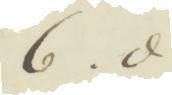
6. d
